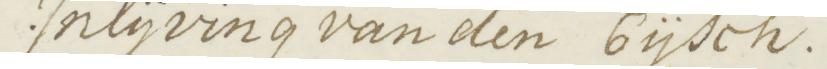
Jnlijving van den Eijsch.
